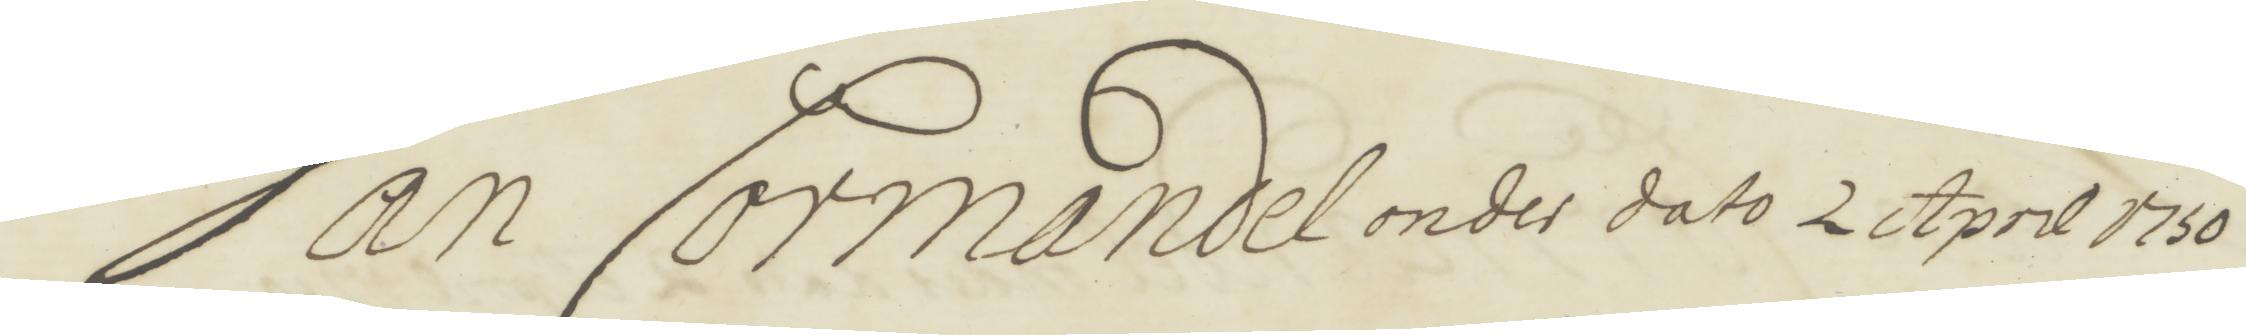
Van Cormandel onder dato 2 April 1750
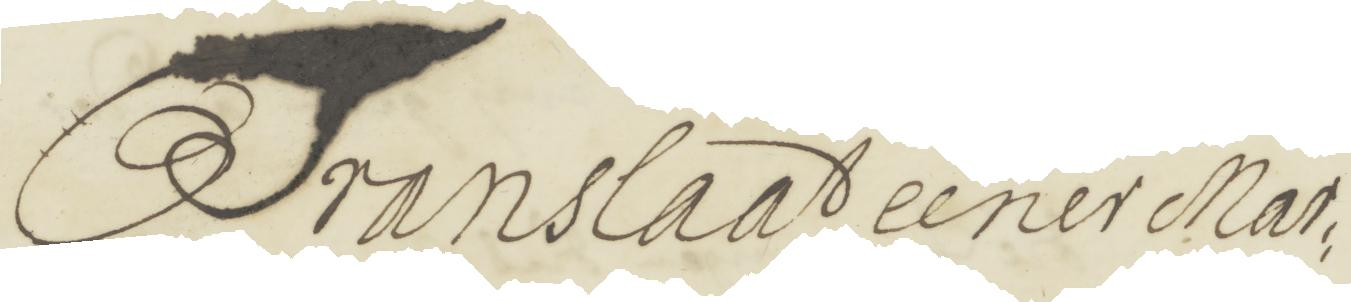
Translaat eener Mar„
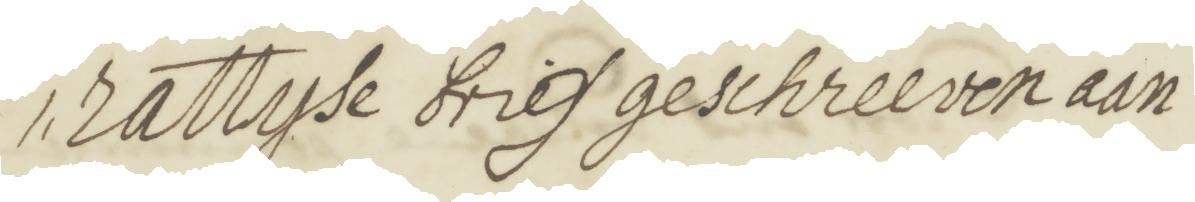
„rattijse brief geschreeven aan
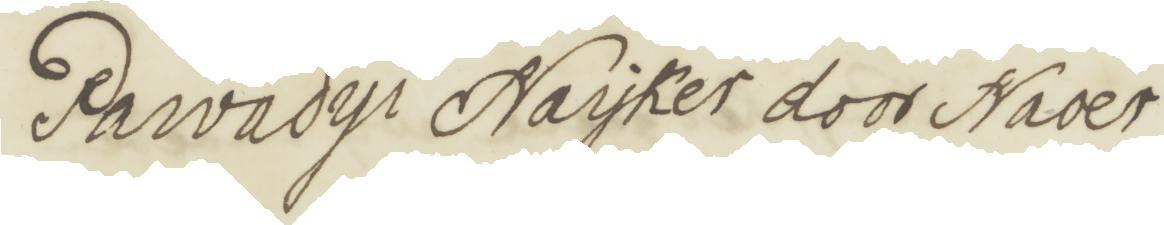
Pawadiji Naijker door Naoer
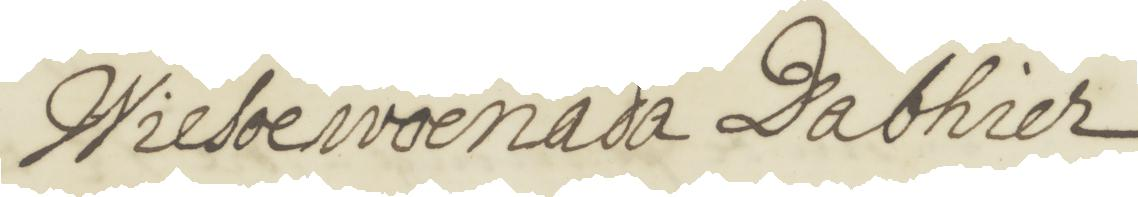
Wiesoewoenada Dabhier
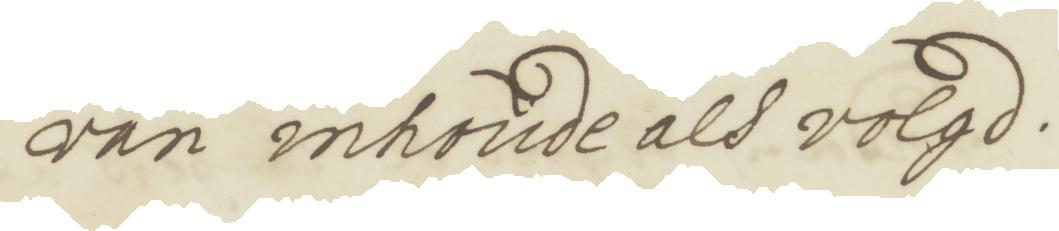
van inhoude als volgd.
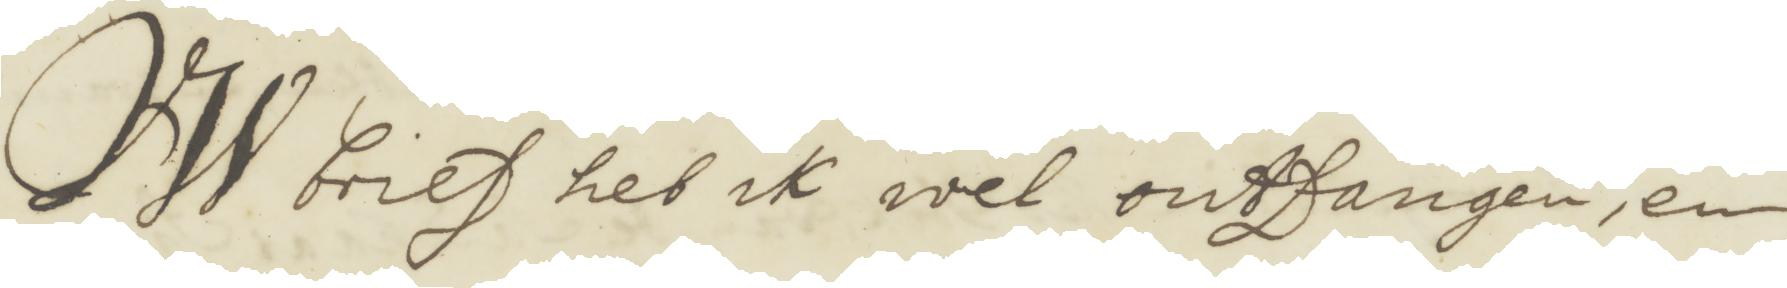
VW brief heb ik wel ontfangen, en
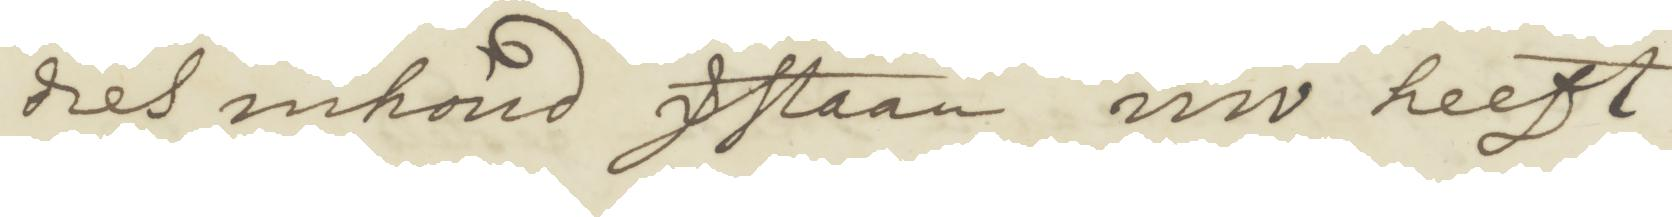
dies inhoud verstaan uw heeft
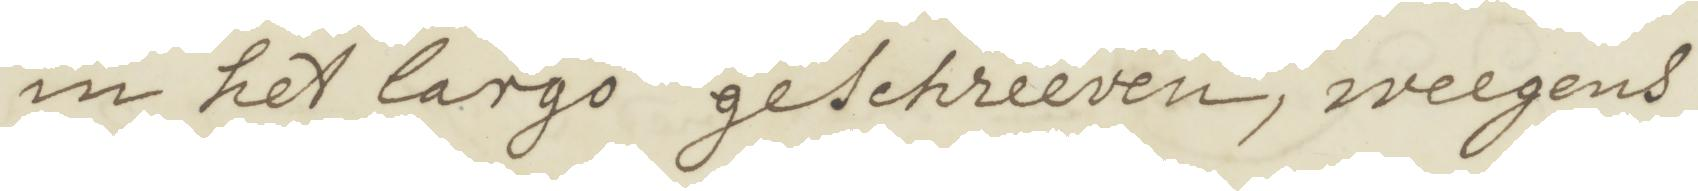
in het largo geschreeven, weegens
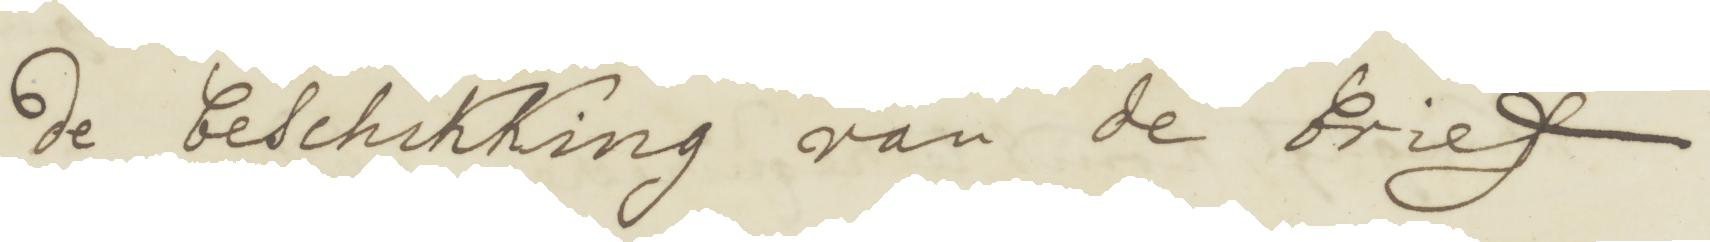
de beschikking van de brief
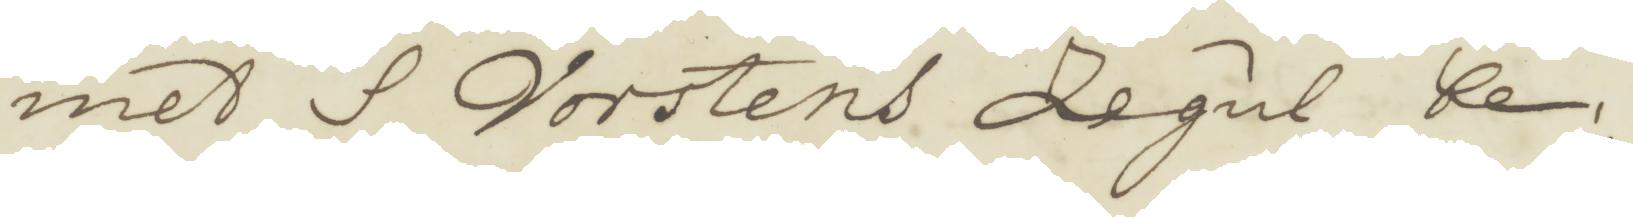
met 's vorstens zegul be„
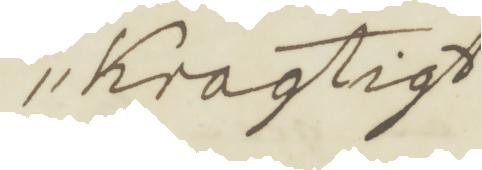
„kragtigt
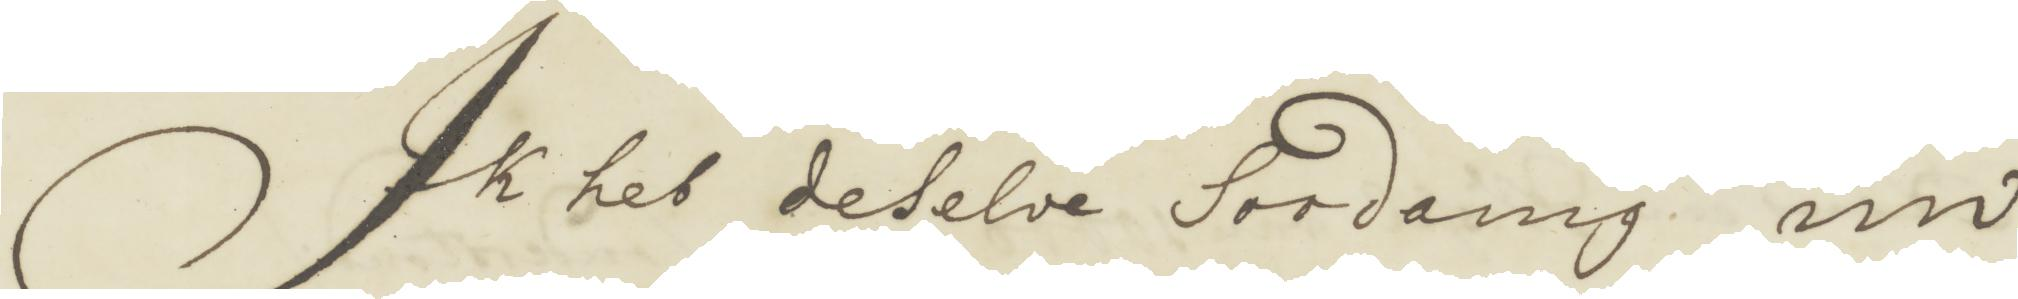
Ik heb deselve soodanig uw
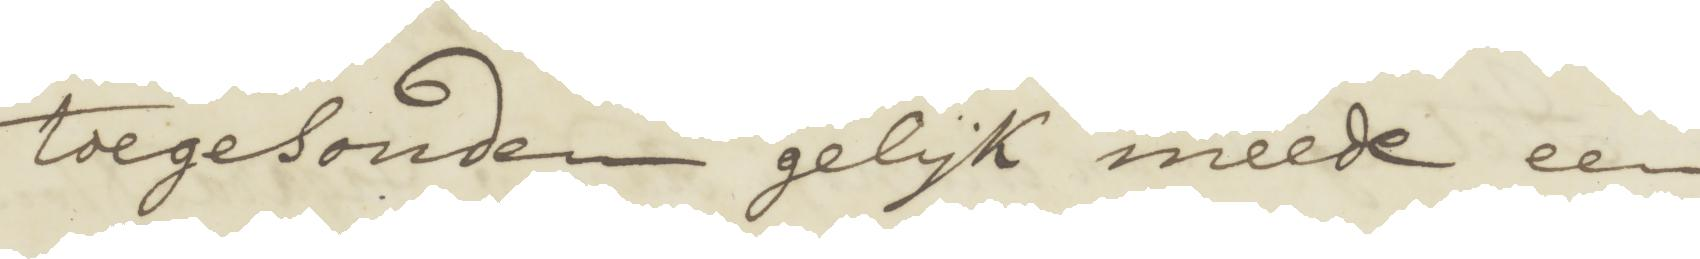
toegesonden gelijk meede een
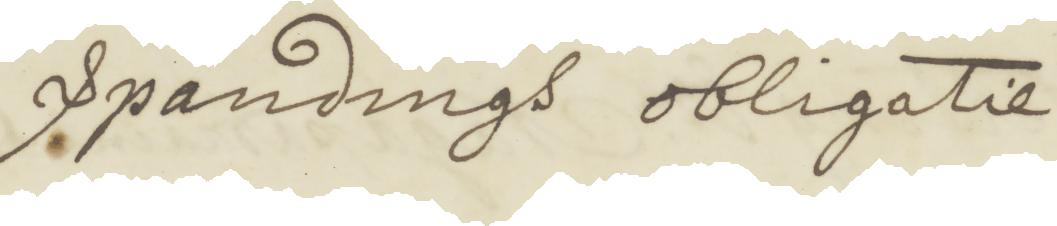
verpandings obligatie
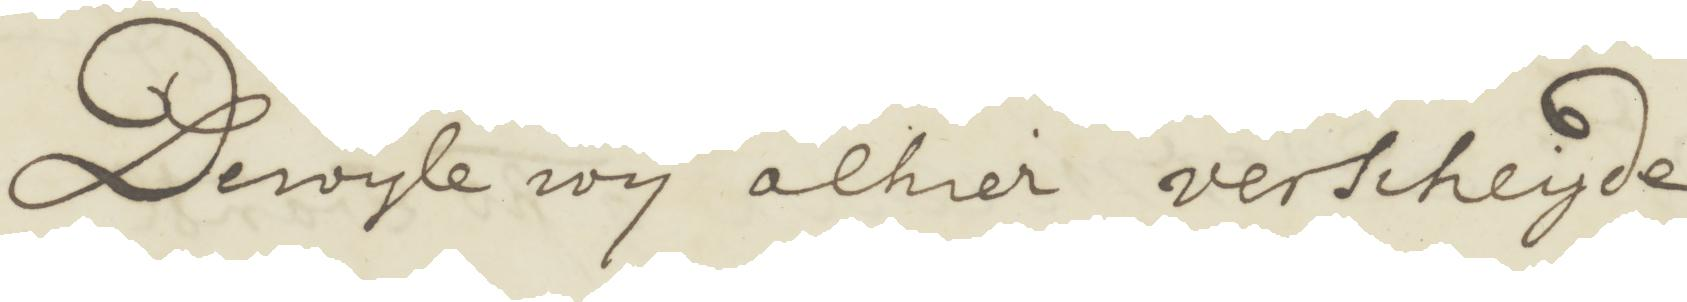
Dewijle wij alhier verscheijde
